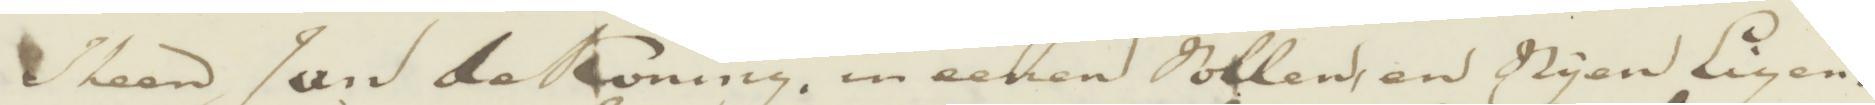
Heer Jan de Koning, in eenen vollen, en vrijen Eigen„
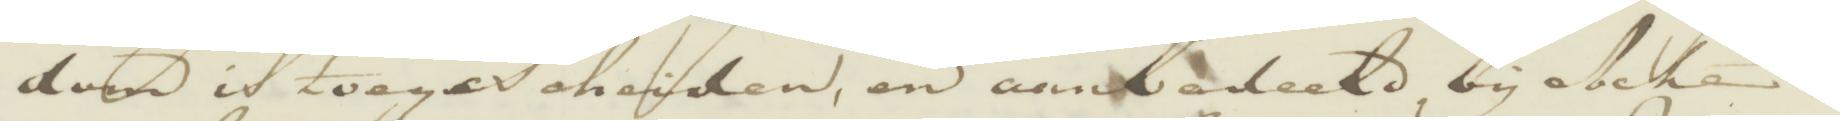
dom is toegescheiden, en aanbedeeld bij Acten.
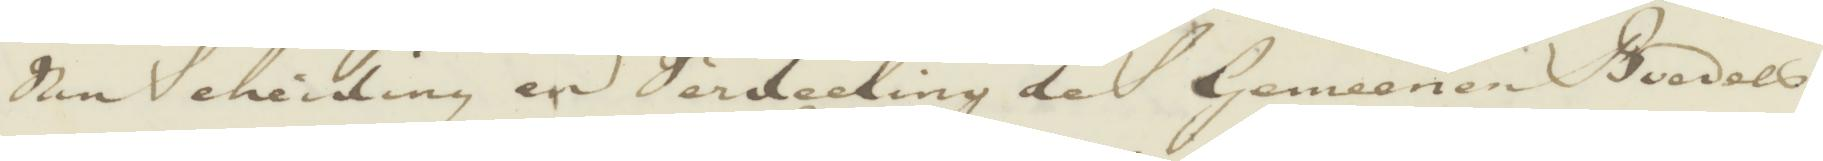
van scheiding en verdeeling des Gemeenen Boedels
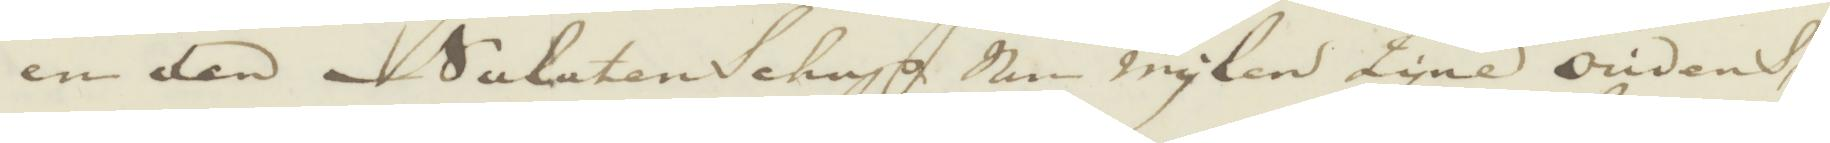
en den Nalatenschap van wijlen zijne ouders,
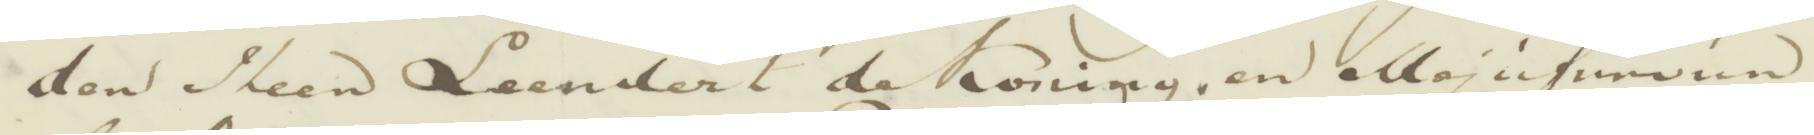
den Heer Leendert de Koning, en Mejufvrouw
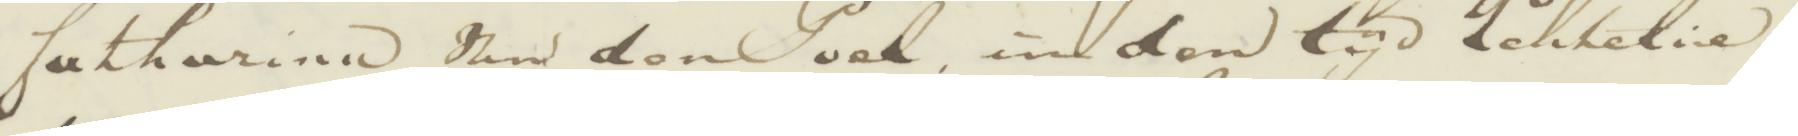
Catharina van den Poel, in den tijd Echtelie
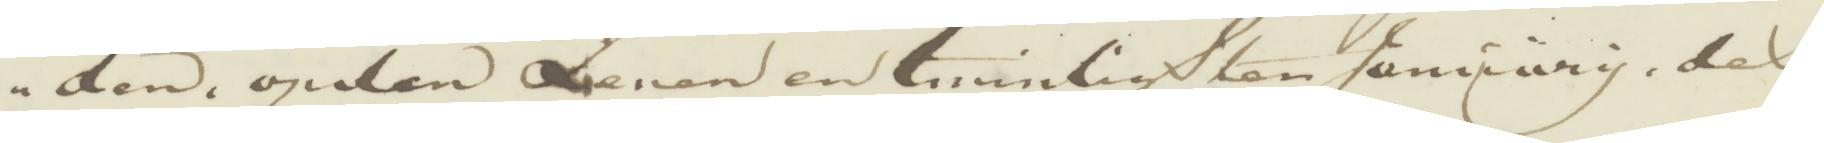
„den, op den Zeven en twintigsten Januarij, des
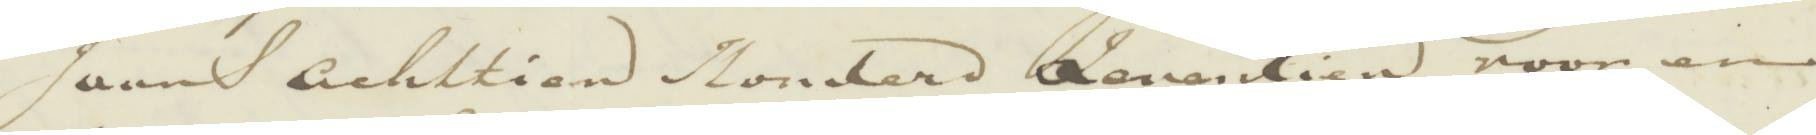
Jaars achttien Honderd Zeventien voor en
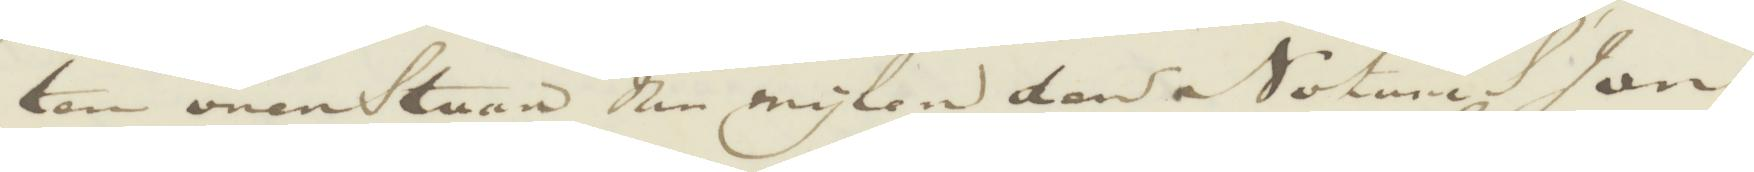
ten overstaan van wijlen den Notaris Jan
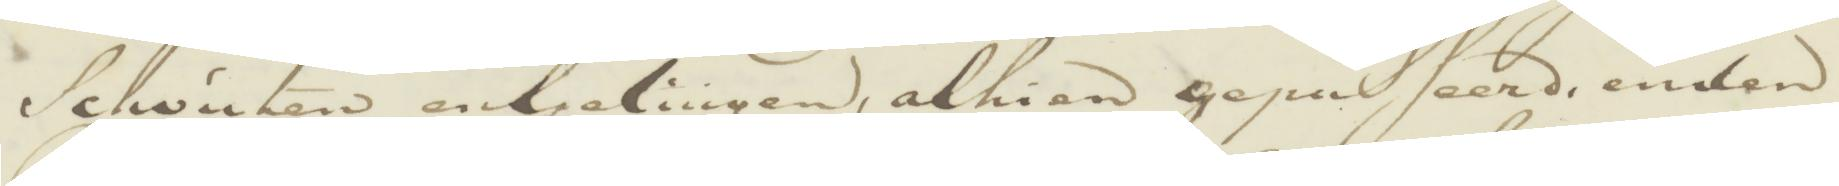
Schouten en Getuigen, alhier gepasseerd, en den
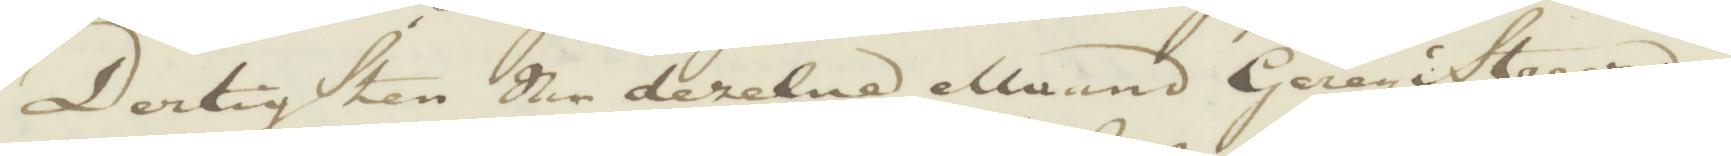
Dertigten van dezelve Maand Geregistreerd.
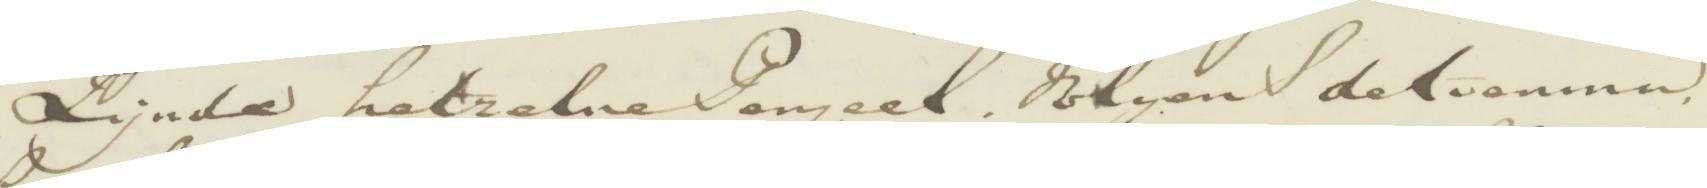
Zijnde hetzelve Perceel, volgens de toenma,
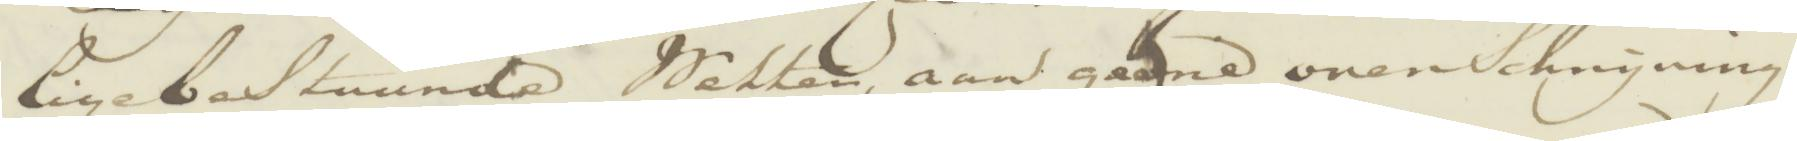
lige bestuurde wetten, aan geene overschrijving
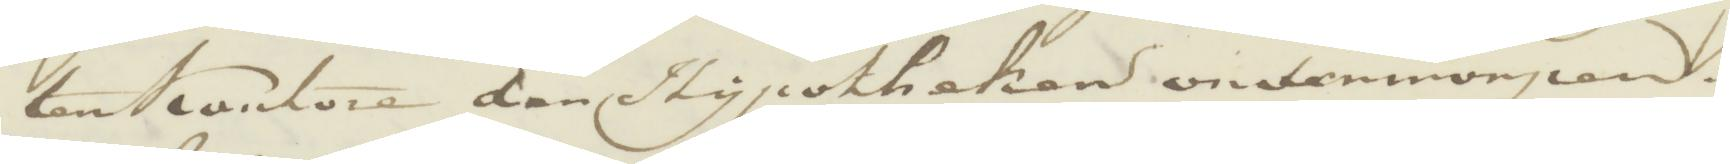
ten Kantore aan Hijpotheken onderworpen.
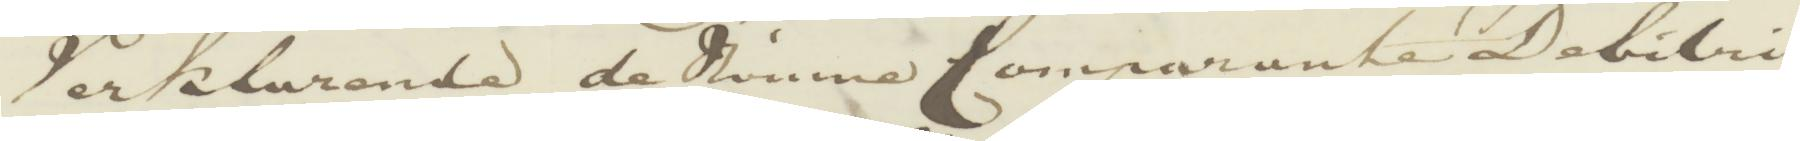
Verklarende de Vrouwe Comparante Debitri
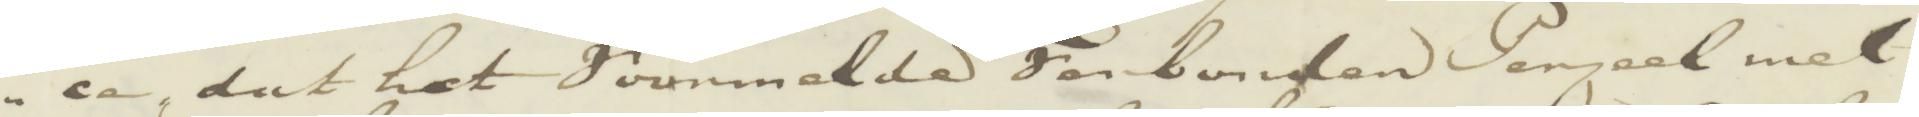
„ce, dat het voormelde verbonden Perceel met
